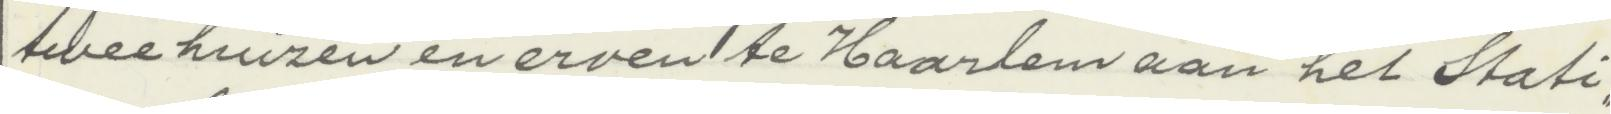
twee huizen en erven te Haarlem aan het stati„
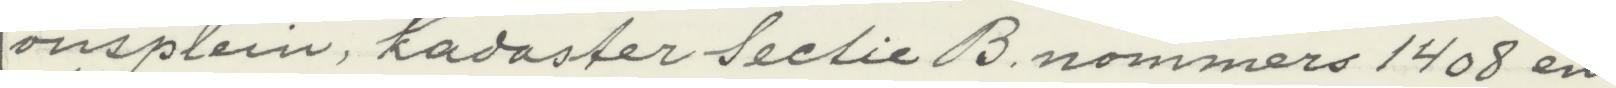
onsplein, kadaster sectie B. nommers 1408 en
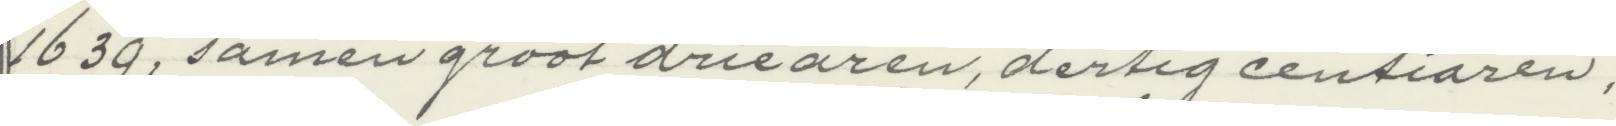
1639, samen groot drie aren, dertig centiaren
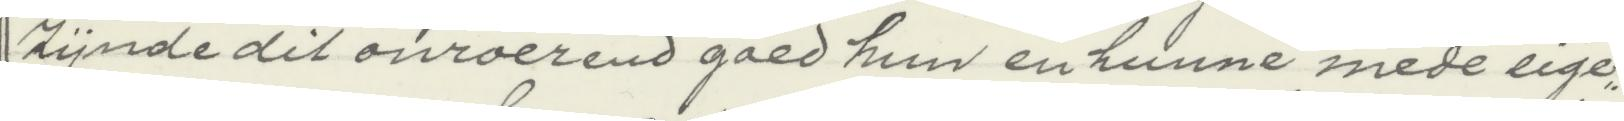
zijnde dit onroerend goed hun en hunne mede eige„
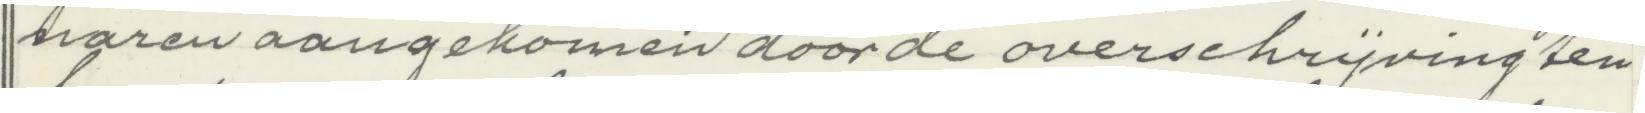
naren aangekomen door de overschrijving ten
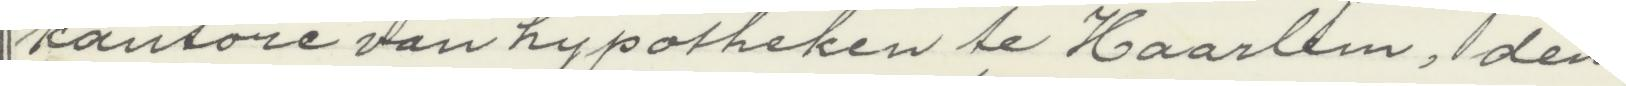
kantore van hypotheken te Haarlem, den
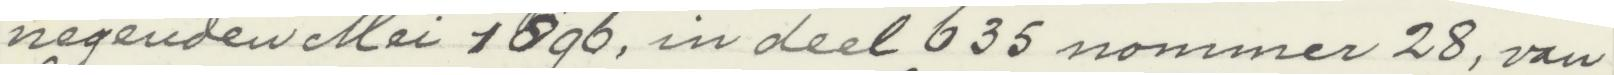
negenden Mei 1896, in deel 635 nommer 28, van
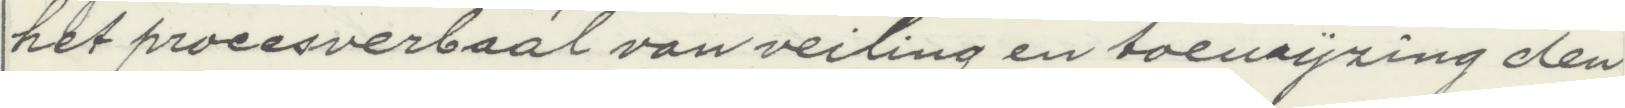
het procesverbaal van veiling en toewijzing den
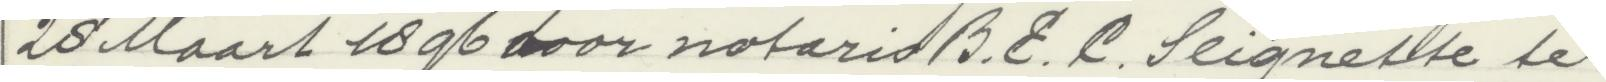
28 Maart 1896 door notaris B. E. C. Seignette te
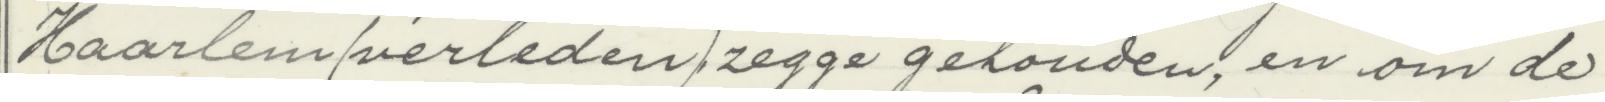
Haarlem (verleden) zegge gehouden, en om de
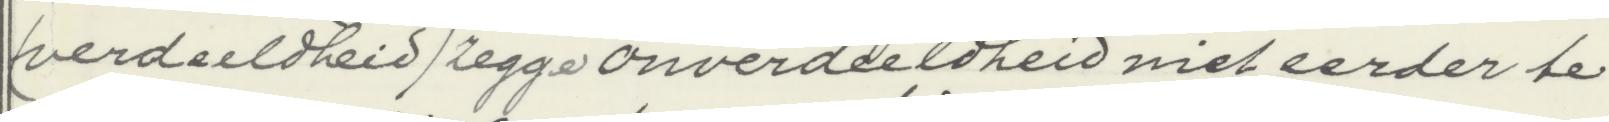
(verdeeldheid) zegge onverdeeldheid niet eerder te
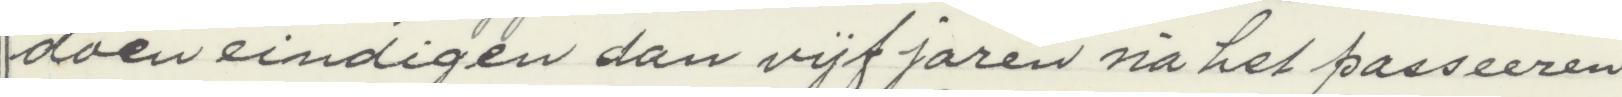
doen eindigen dan vijf jaren na het passeeren
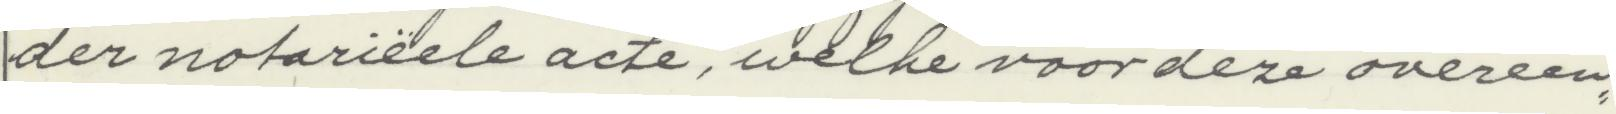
der notariëele acte, welke voor deze overeen„
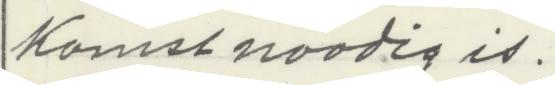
komst noodig is.
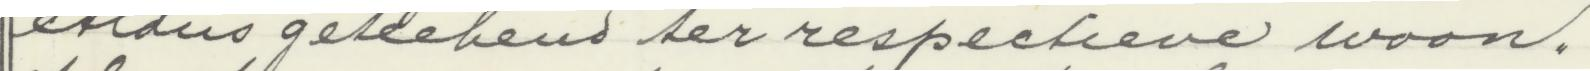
Aldus geteekend ter respectieve woon„
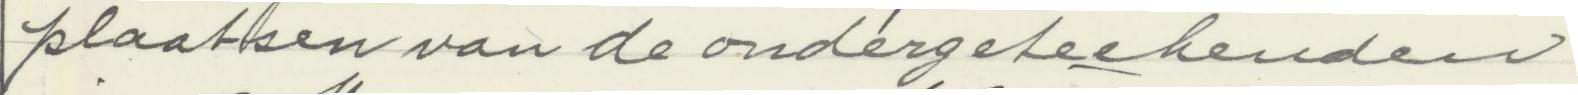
plaatsen van de ondergeteekenden
